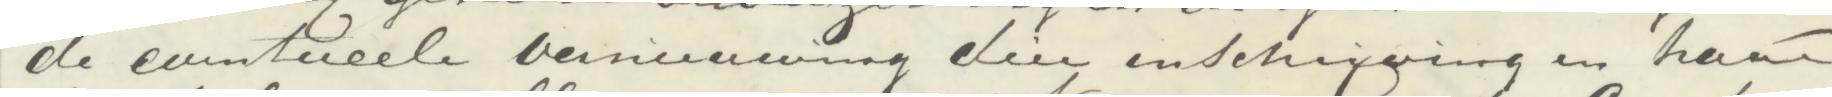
de eventueele vernieuwing dier inschrjving en haar
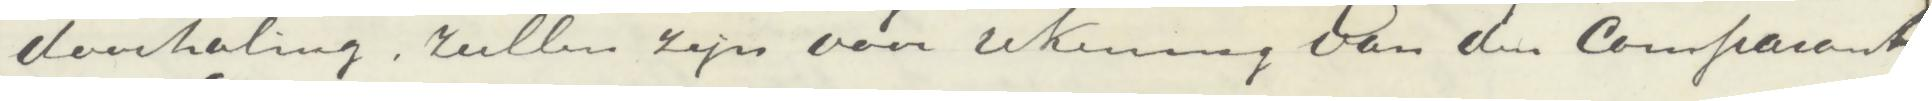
doorhaling, zullen zijn voor rekening van den Comparant
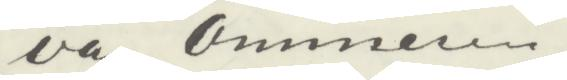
vam Ommeren
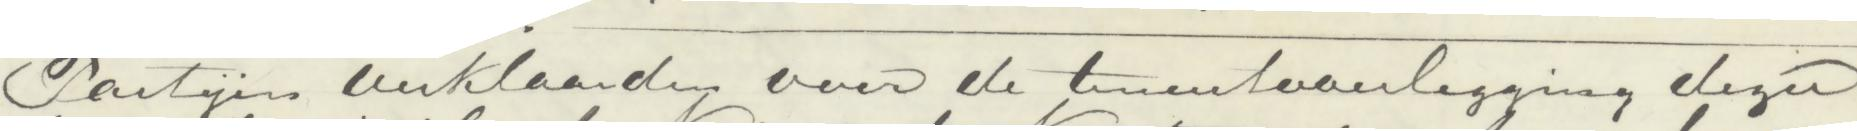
Partijen verklaarden voor de tenuitvoerlegging dezer
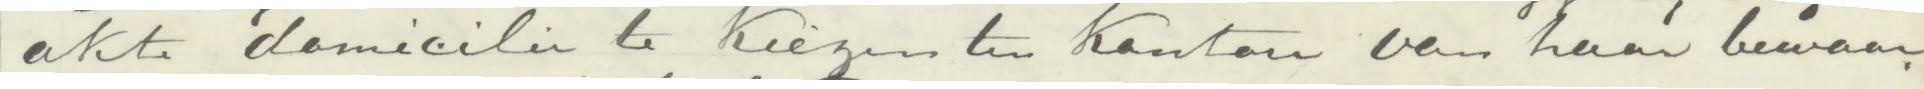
akte domicilie te kiezen ten kantore van haar bewaar„
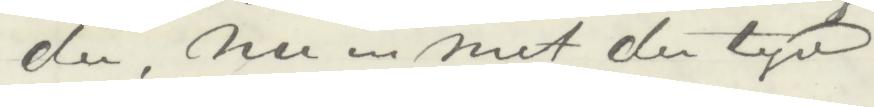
der, nu en met der tyd
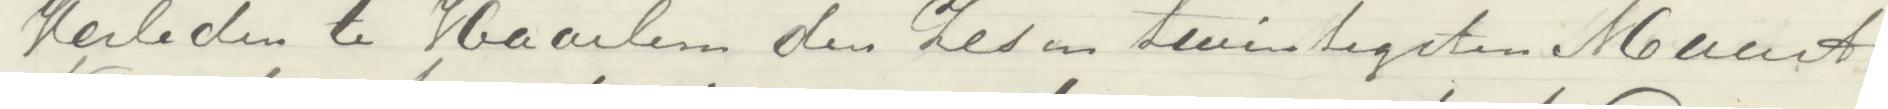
Verleden te Haarlem den Zes en twintigsten Maart
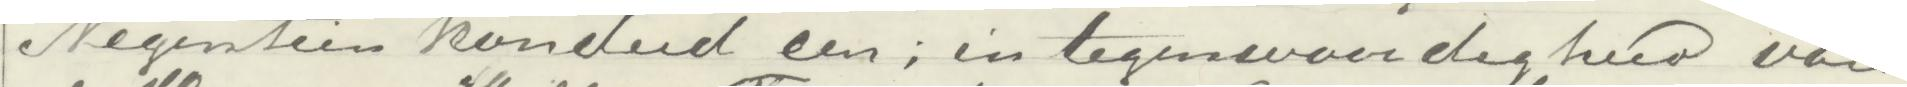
Negentien honderd een; in tegenwoordigheid van
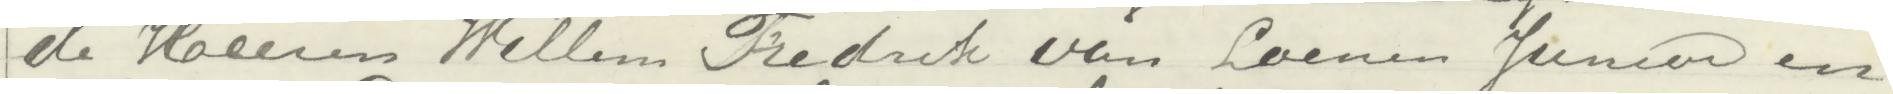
de Heeren Willem Fredrik van Loenen Junior en
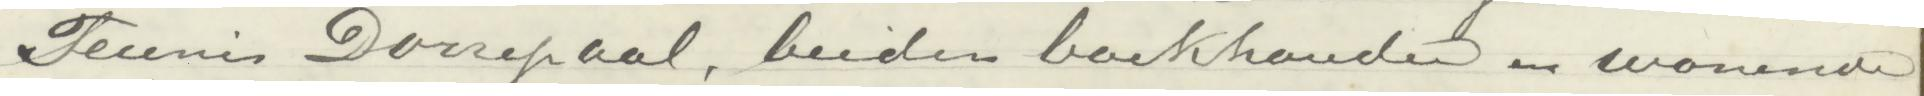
Teunis Dorrepaal, beiden boekhouder en wonende
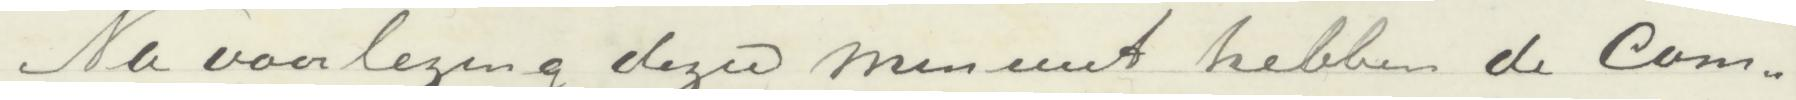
Na voorlezing dezer minuut hebben de Com„
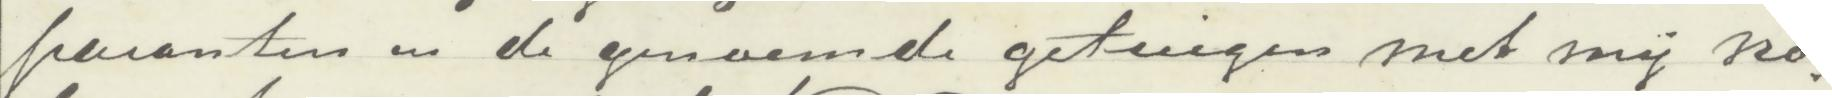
paranten en de genoemde getuigen met mij no„
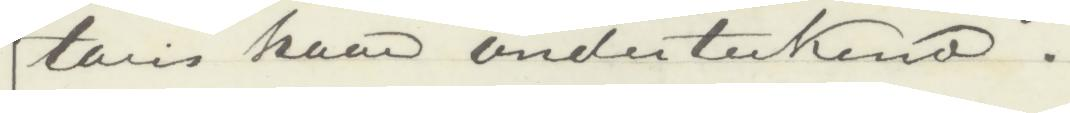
taris haar onderteekend.
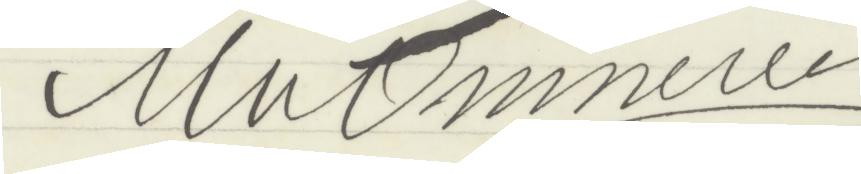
MvOmmeren
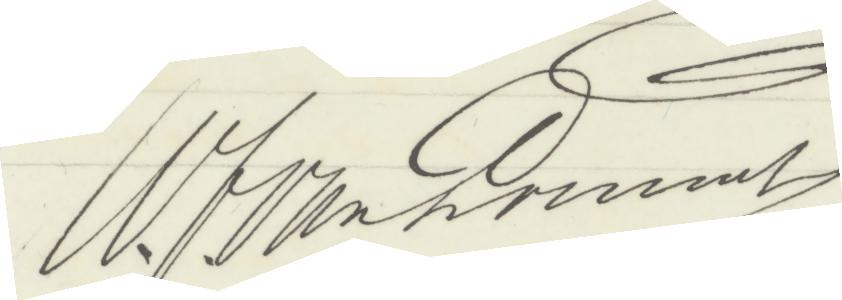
W.FvanLoenenjr
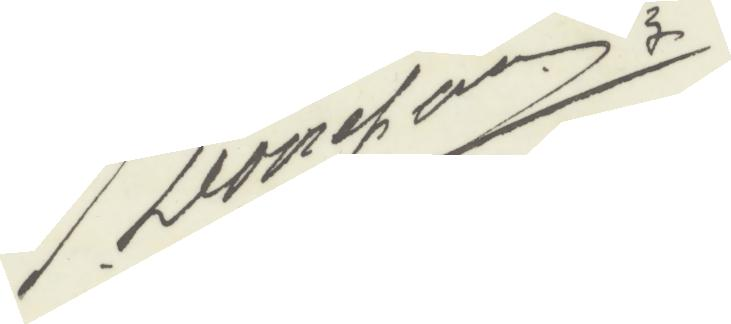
T.Dorrepaal Pz
